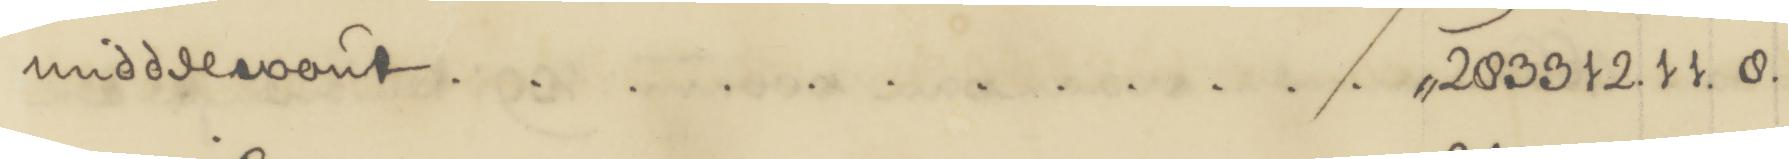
middelwout . . . . . . . . . . . . „283312.11.8.
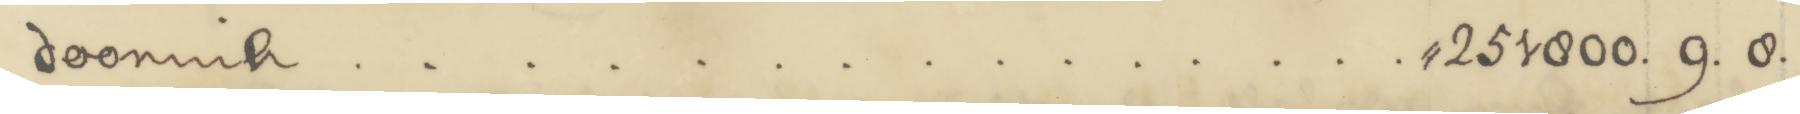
doornik . . . . . . . . . . . . . . . „251800.9.8.
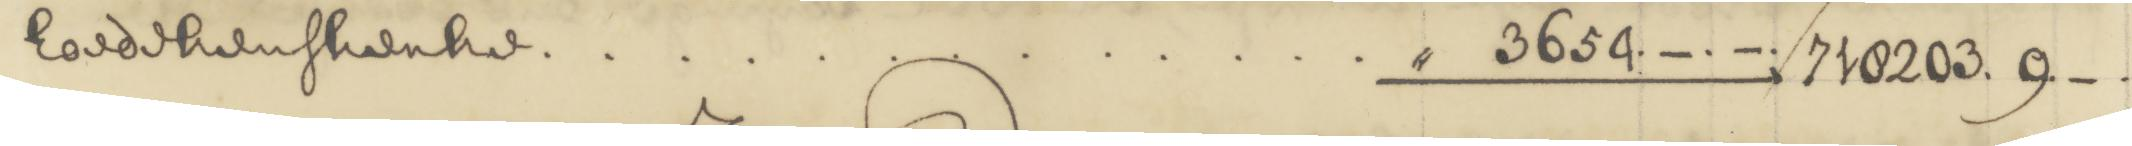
hoedekenskerke . . . . . . . . . . . . . „ 3654.—.—. ƒ718203.9.—
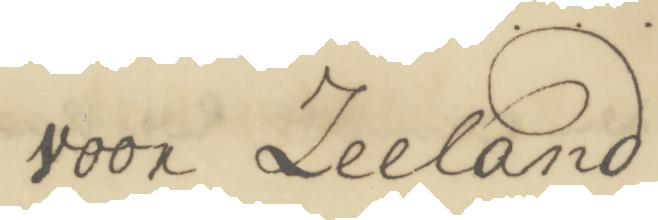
voor Zeeland
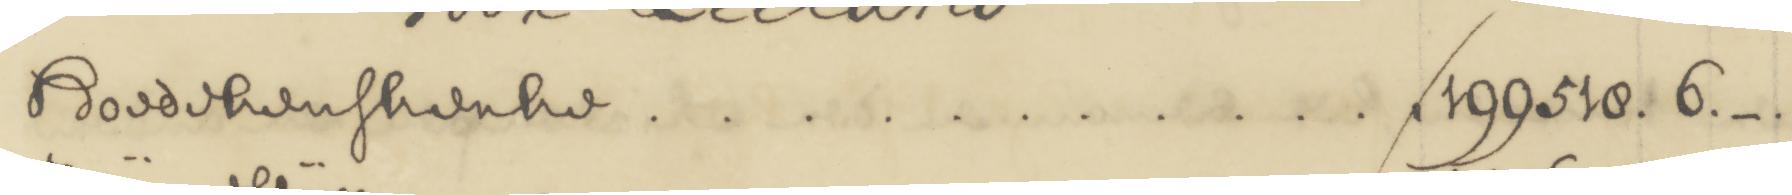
Hoedekenskerke . . . . . . . . . . . ƒ199518.6.—.
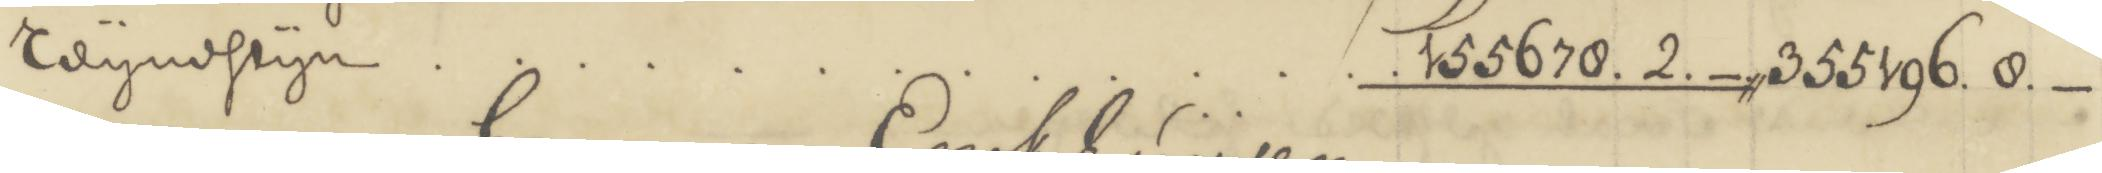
reijnestijn . . . . . . . . . . . . . . 155678.2.—„355196.8.—
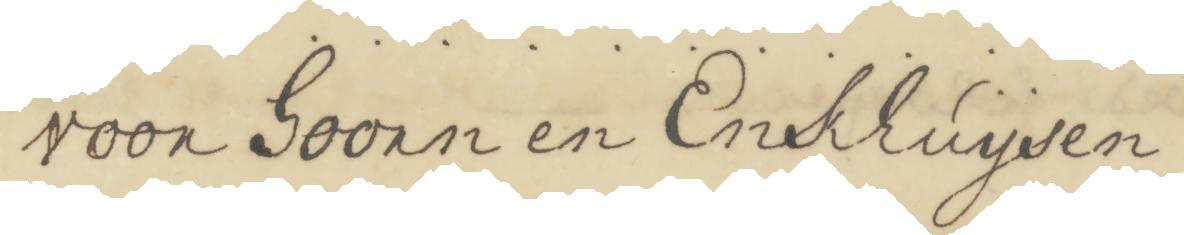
voor Hoorn en Enkhuijsen
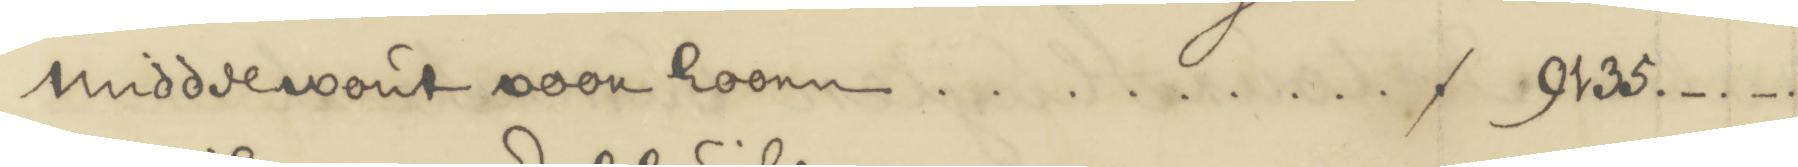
middelwout voor hoorn . . . . . . . . . ƒ 9135.—.—.
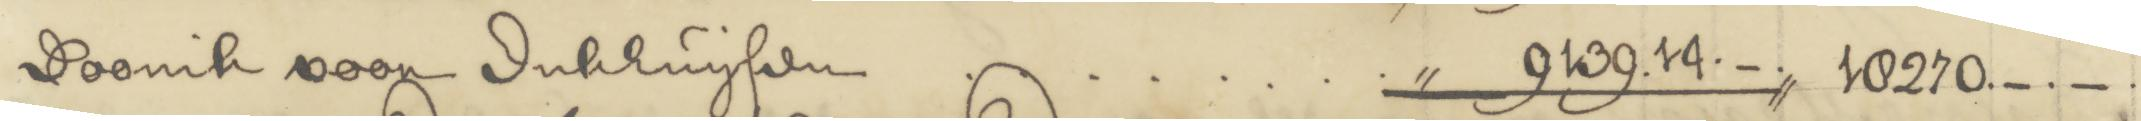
Doonik voor Enkhuijsen . . . . . . . . „ 9139.14.—. „ 18270.—.—.
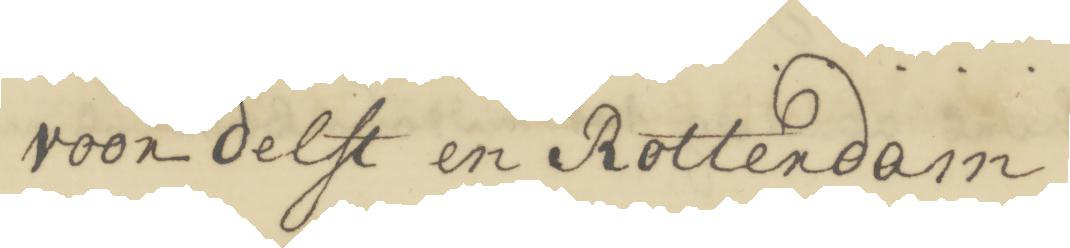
voor delft en Rotterdam
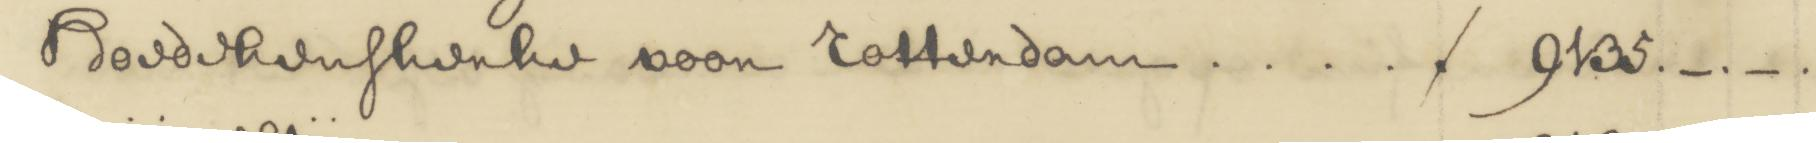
Hoedekenskerke voor rotterdam . . . . ƒ 9135.—.—.
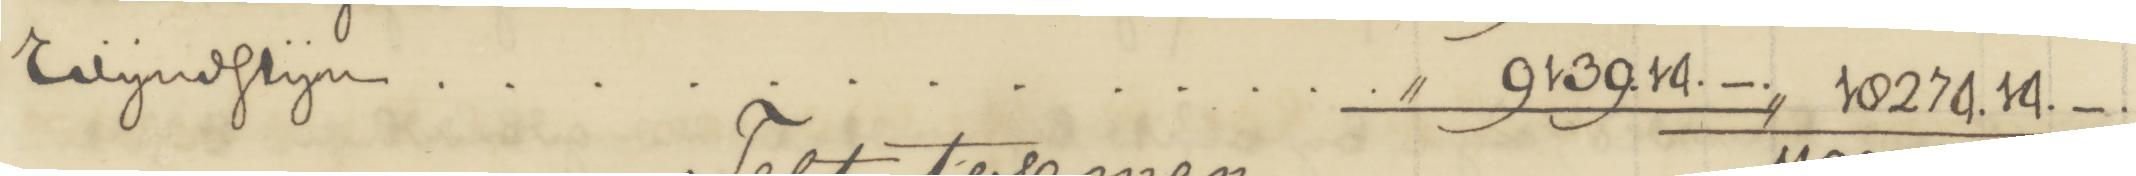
reijnestijn . . . . . . . . . . . . . „ 9139:14.—. „ 18274.14.—.
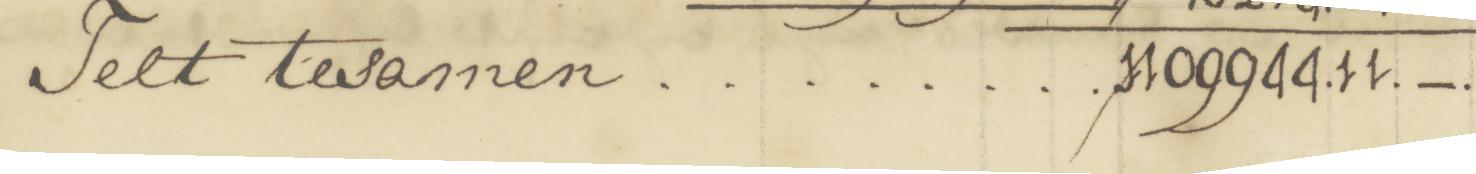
Telt tesamen. . . . . . . . ƒ1109944.11.—.
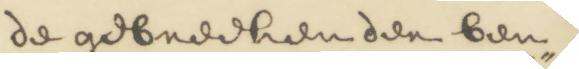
de gebreeken der ben„
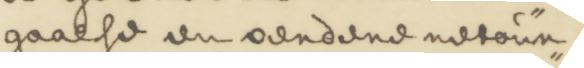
gaalse en verdere retour„
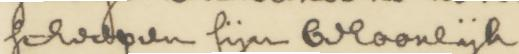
scheepen sijn behoorlijk
